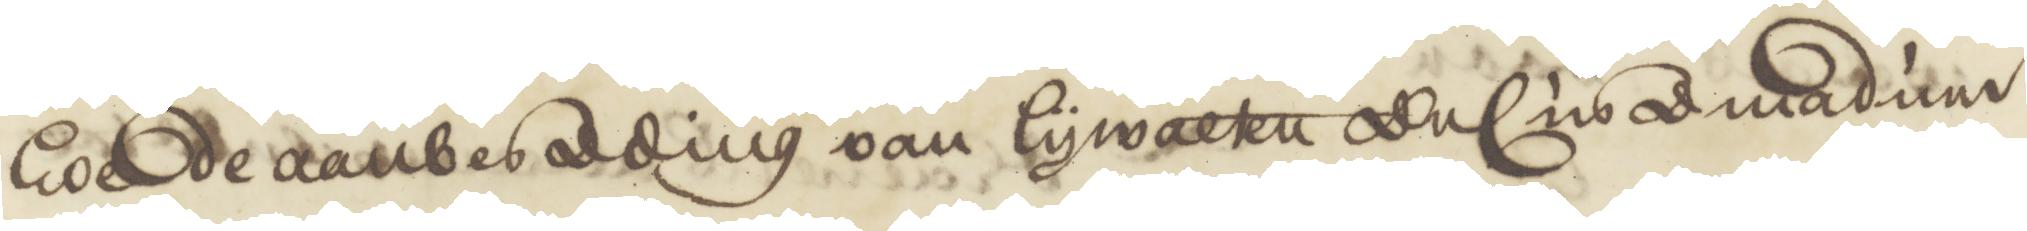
hoe de aanbesteding van lijwaeten ter Custe madure
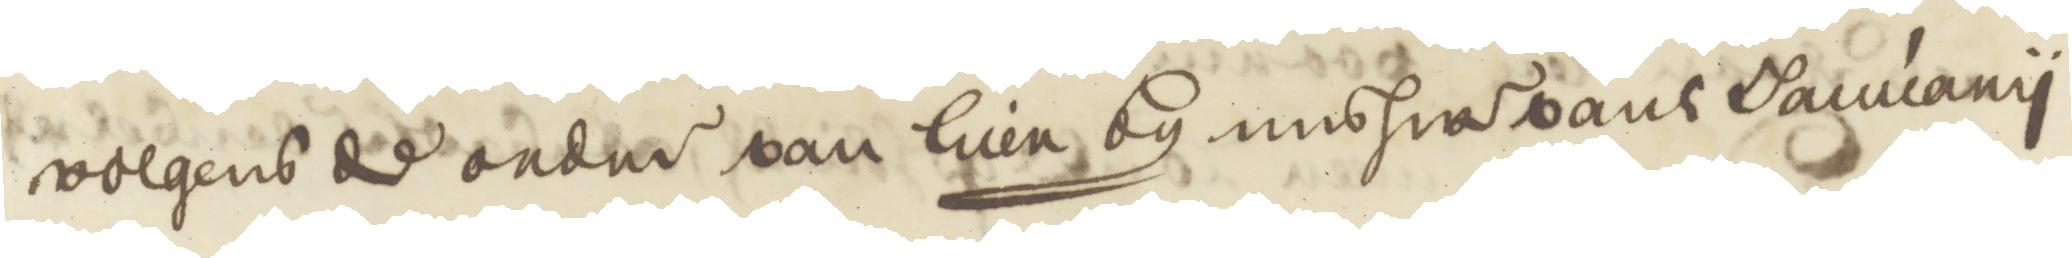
volgens de ordre van hier by missive van 5 Ianuarij
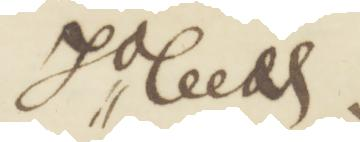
I„o leeden
